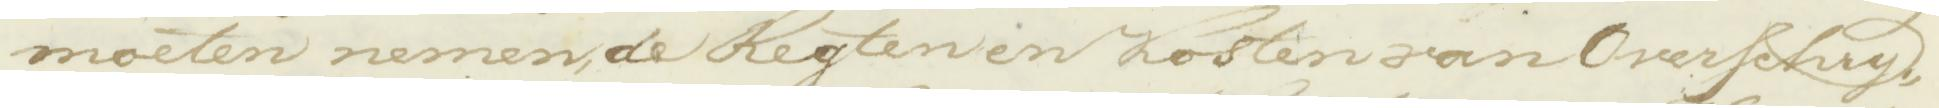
moeten nemen, de Regten en Kosten van Overschryv„
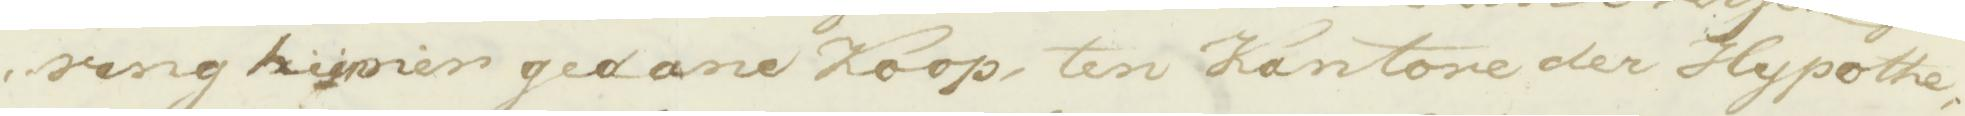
„ving hunner gedane Koop ten Kantore der Hypothe,
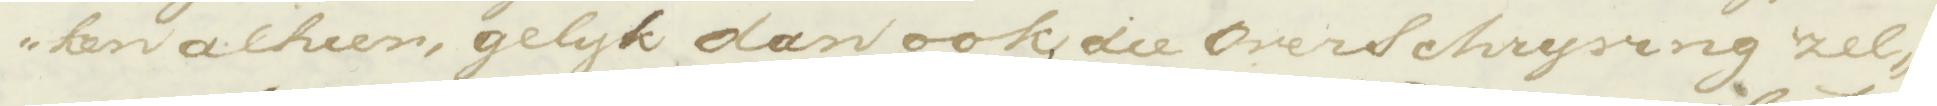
„ken alhier, gelyk dan ook die overschryving zel„
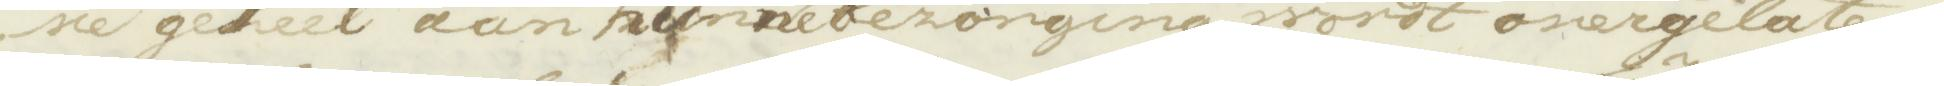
„ve geheel aan hunne bezorging wordt overgelaten
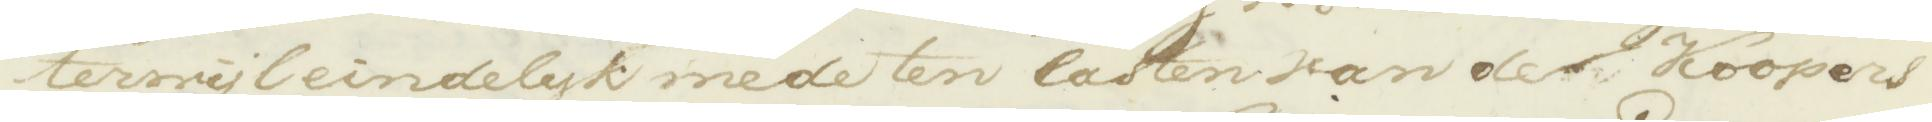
terwijl eindelyk mede ten lasten van den Koopers
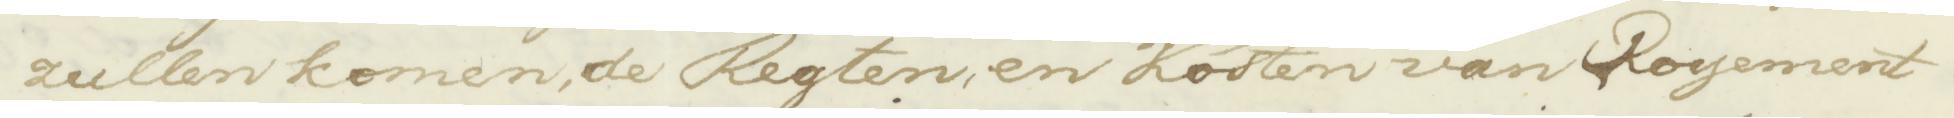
zullen komen, de Regten, en Kosten van Royement
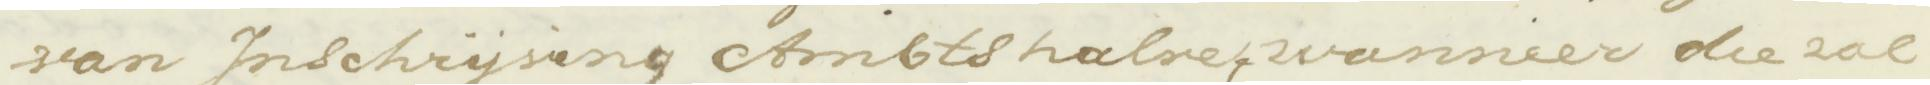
van Jnschrijving Ambtshalre, wanneer die zal
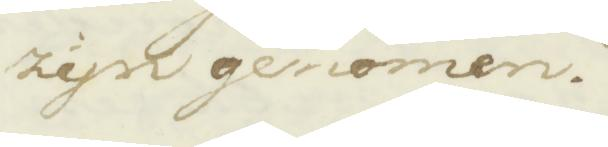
zyn genomen.
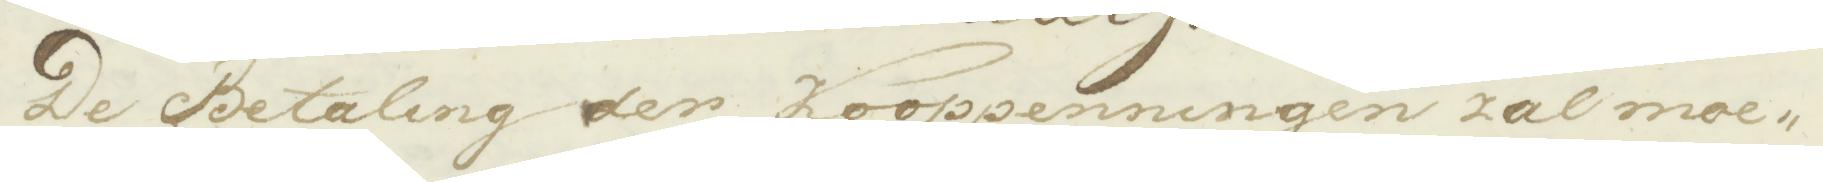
De Betaling der Kooppenningen zal moe„
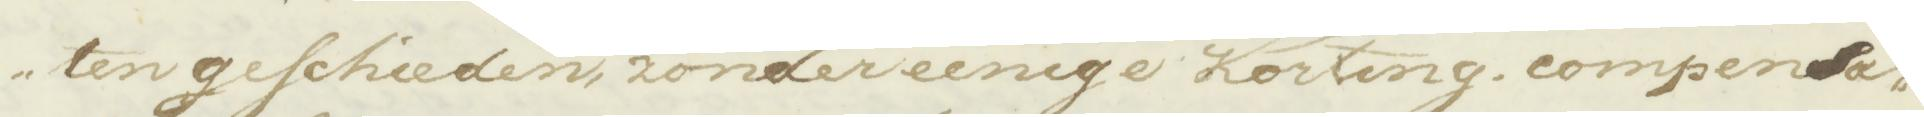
„ten geschieden, zonder eenige Korting, compensa„
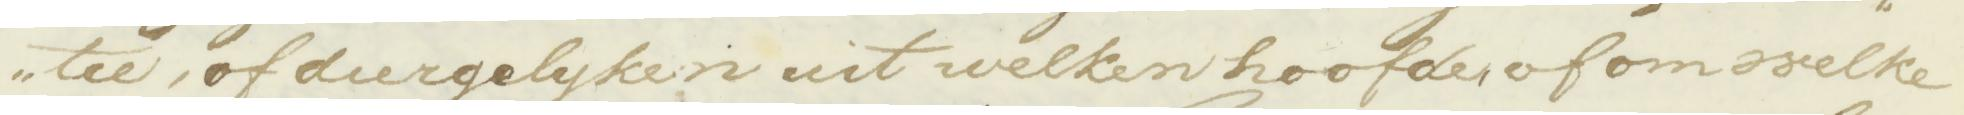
„tie, of diergelyken uit welken hoofde, of om welke
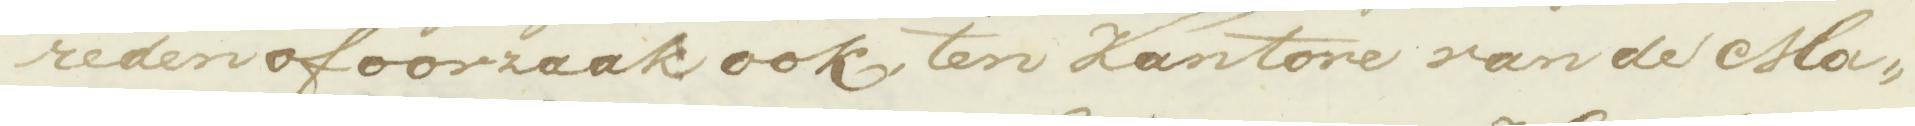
reden of oorzaak ook ten Kantore van de Ma„
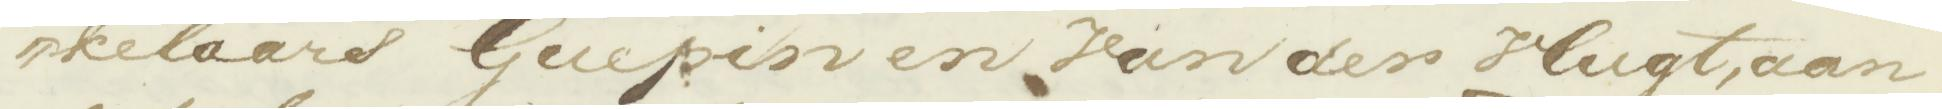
„kelaars Guepen en Van der Vlugt, aan
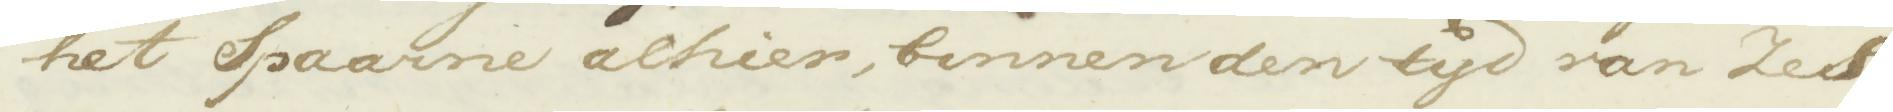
het Spaarne alhier, binnen den tyd van Zes
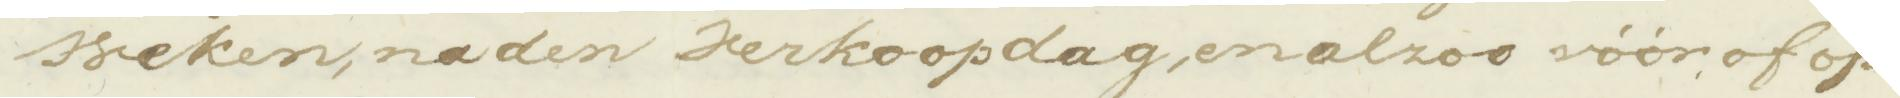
weken, na den verkoopdag, en alzoo vóór, of op
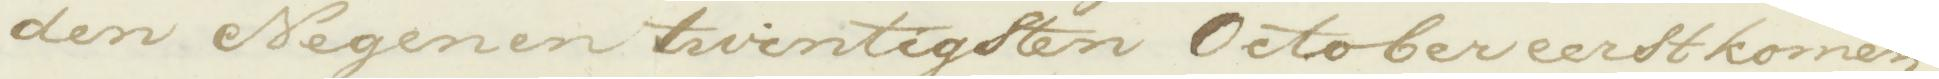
den Negen en twintigsten October eerst komen
